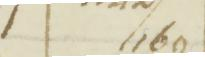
1 1142/169
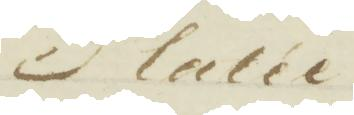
Platée
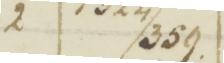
2 1324/359.
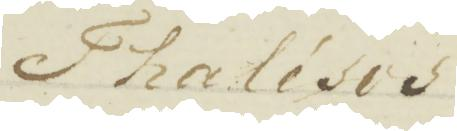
Thalésos
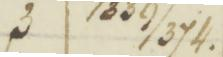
3 1339/374.
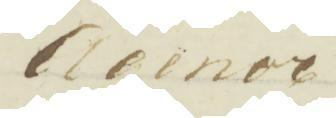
Agenor
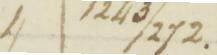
4 1243/272.
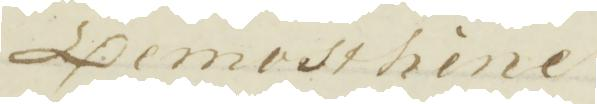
Demosthène
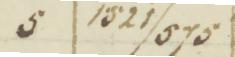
5 1521/575
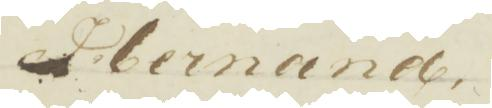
Hernandez
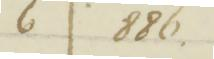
6 886.
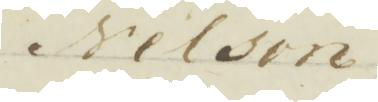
Nelson
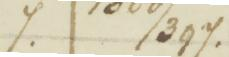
7 1360/397
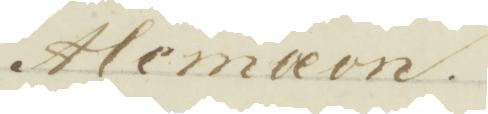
Alcmaeon.
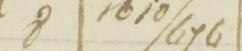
8 1610/676
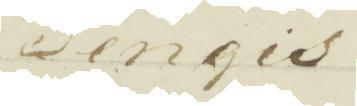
Gengis
